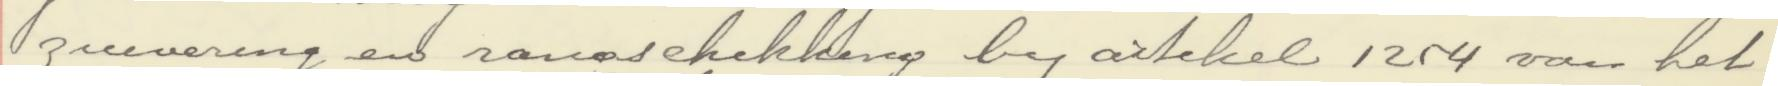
zuivering, en rangschikking by artikel 1254 van het
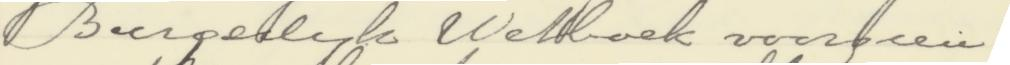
Burgelyk Wetboek voorzien
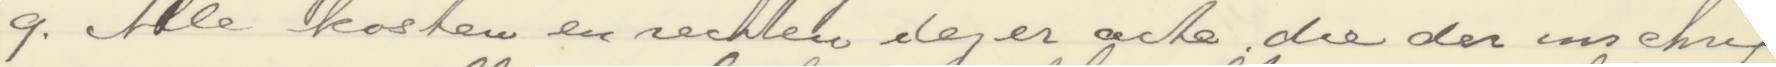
9. Alle kosten en rechten dezer acte die der inschry
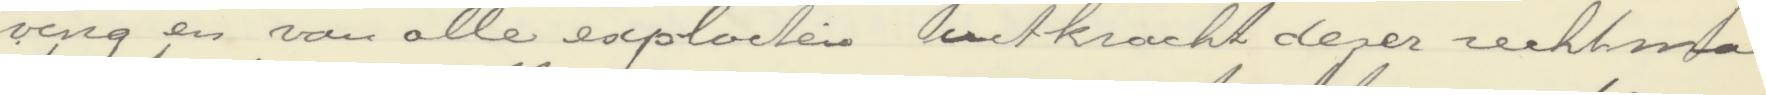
ving en van alle exploiten uit kracht dezer rechtma
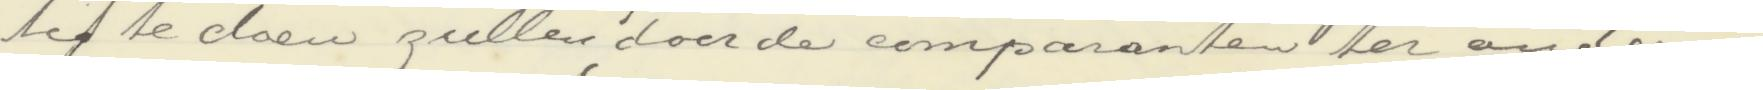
tig te doen zullen door de comparanten ter andere
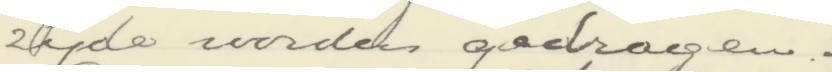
zijde worden gedragen
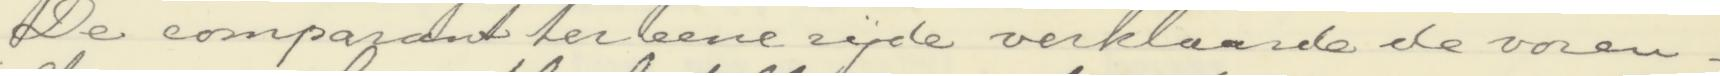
De comparant ter eene zijde verklaarde de voren
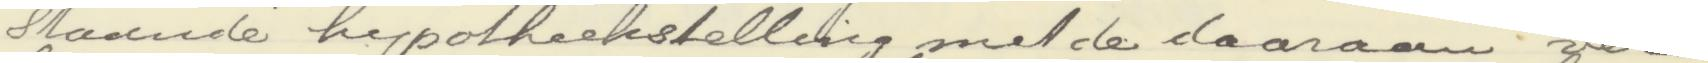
staande hypotheekstelling met de daaraan ver
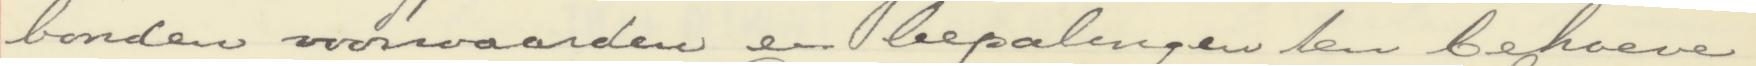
bonden voorwaarden en bepalingen ten behoeve
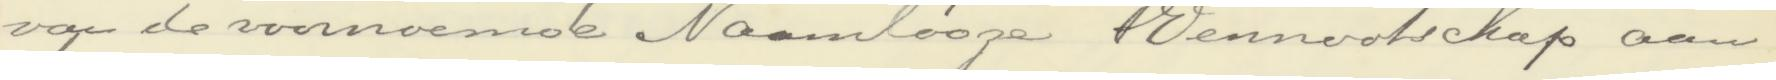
van de voornoemde Naamlooze Vennootschap aan
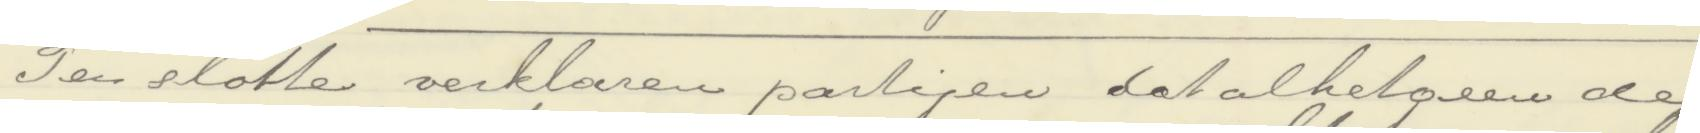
Ten slotte verklaren partijen dat alhet geen de
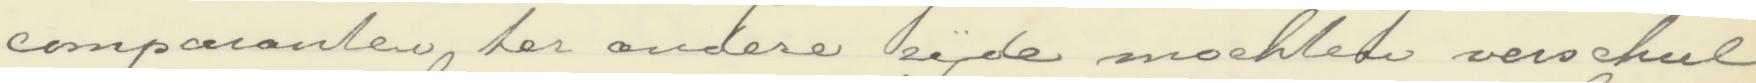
comparanten, ter andere zijde mochten veschul
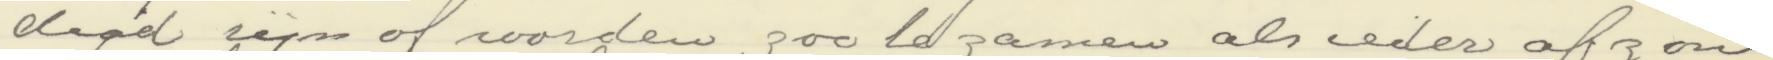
digd zijn of worden, zoo te zamen als ieder afzon
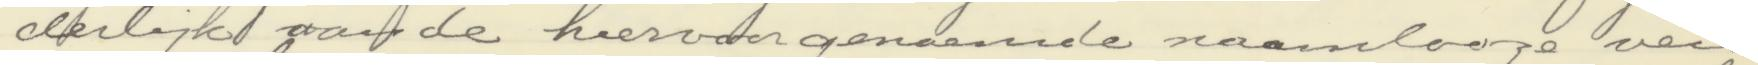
derlijk, van de hiervoorgenoemde naamlooze ven
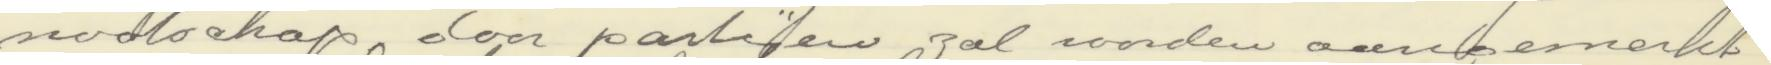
nootschap, door partijen zal worden aangemerkt
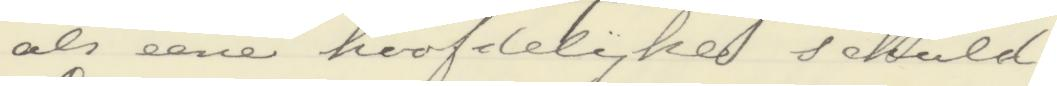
als eene hoofdelijke schuld
